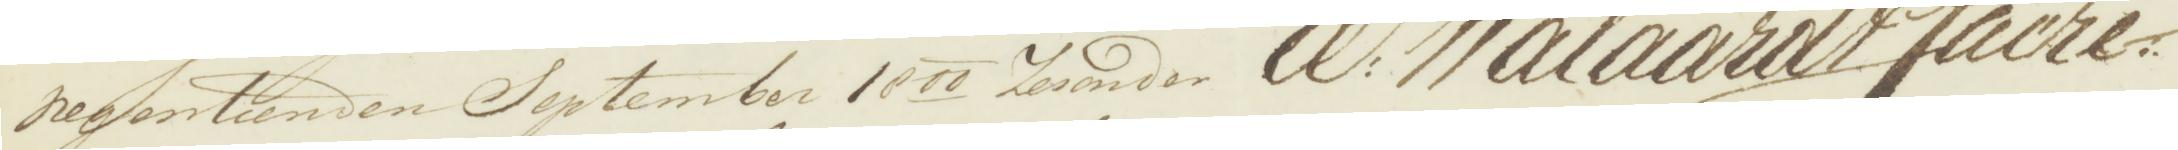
negentienden September 1800 Zesender A: Walaardt Sacre:
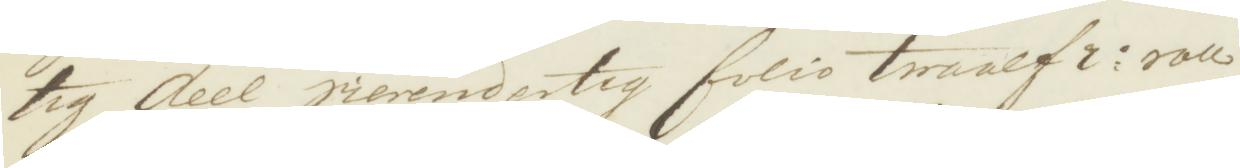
tig deel vierendertig folio twaalf r:o vak
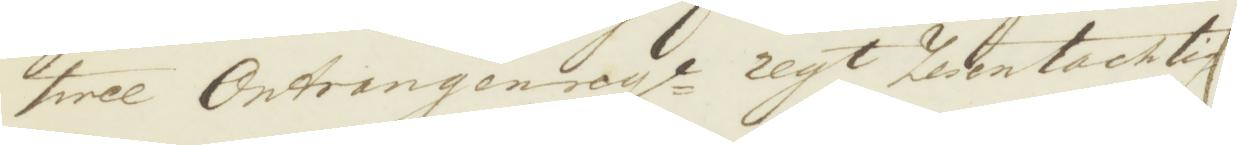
twee Ontvangen reg=t regt zeven tachtig
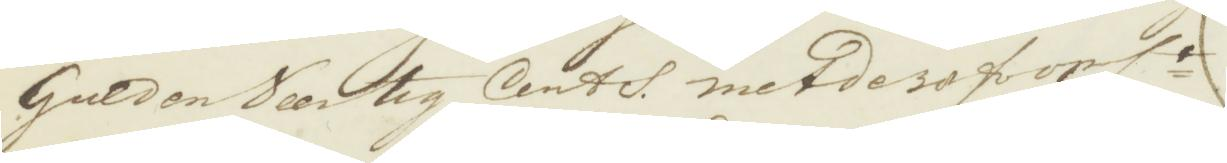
Gulden Veertig Cents. met de 30% opC=t
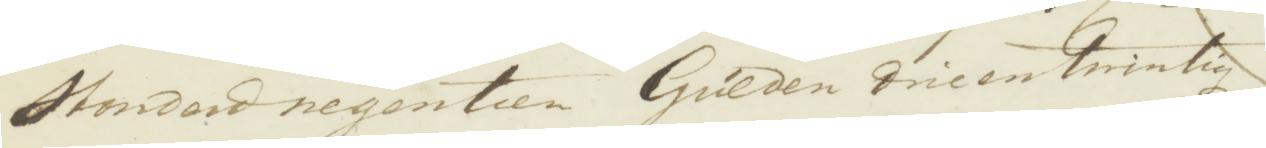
Honderd negentien Gulden drie en twintig
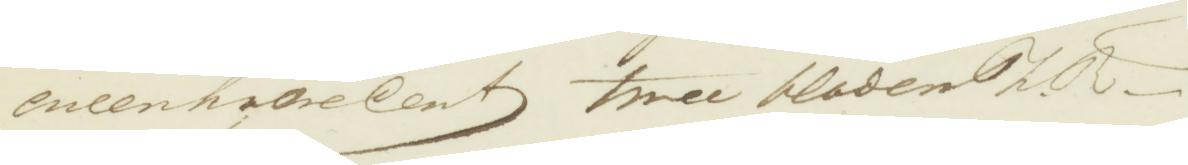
en een halve cent twee bladen ZR
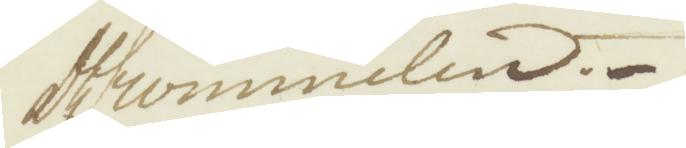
d„f: Crommelin._
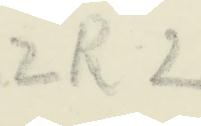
2R 2
